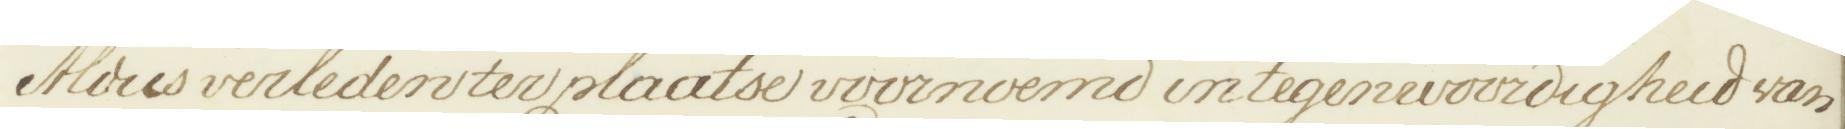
Aldus verleden ter plaatse voornoemd in tegenwoordigheid van
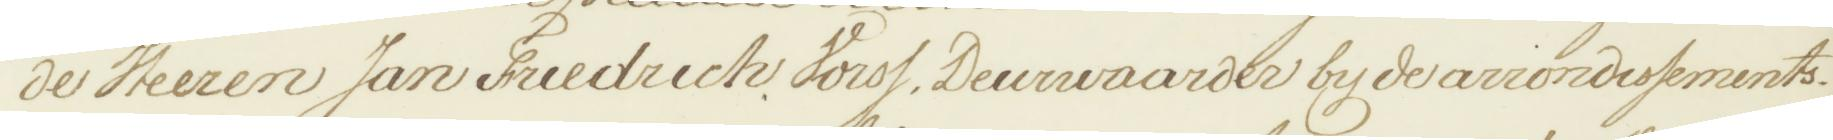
de Heeren Jan Friedrich Vorss, Deurwaarder by de arrondissements.
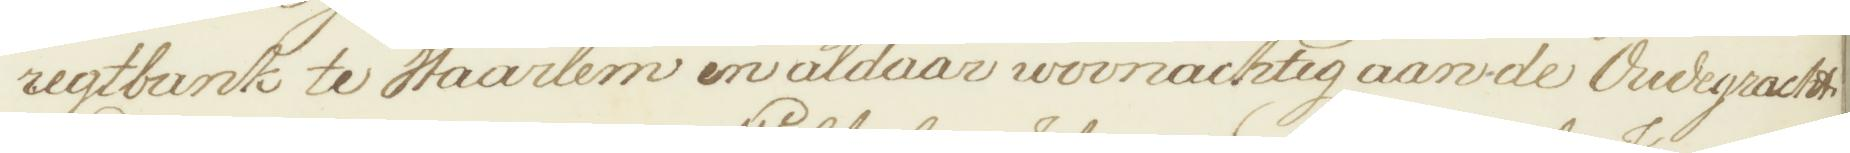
regtbank te Haarlem en aldaar woonachtig aan de Oudegracht
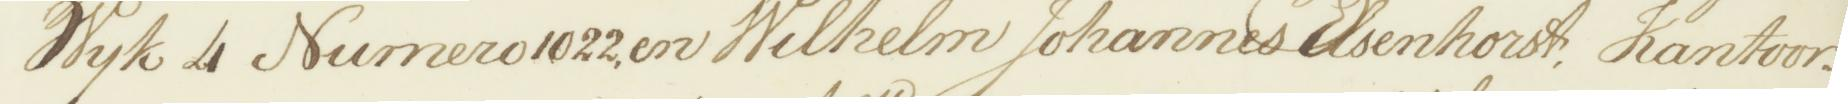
Wyk 4 Numero 1022, en Wilhelm Johannes Elsenhorst, Kantoor„
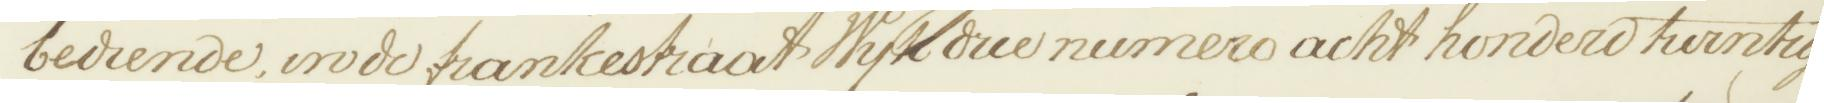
bediende, in de frankestraat Wyk drie numero acht honderd twintig
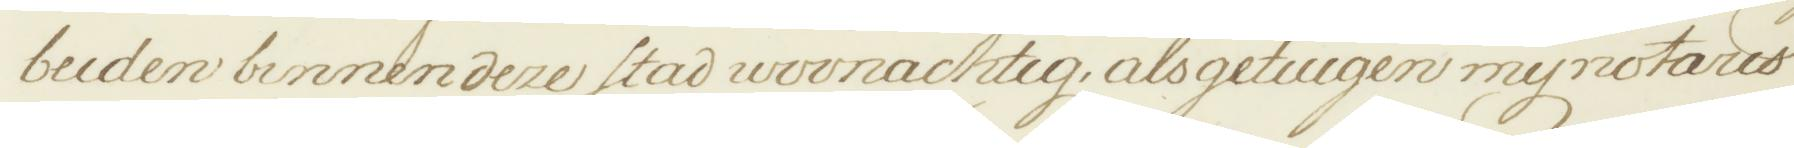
beiden binnen deze stad woonachtig, als getuigen my notaris
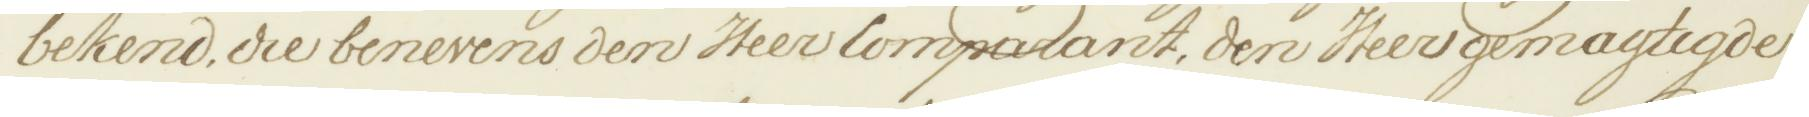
bekend, die benevens den Heer Comparant, den Heer gemagtigde
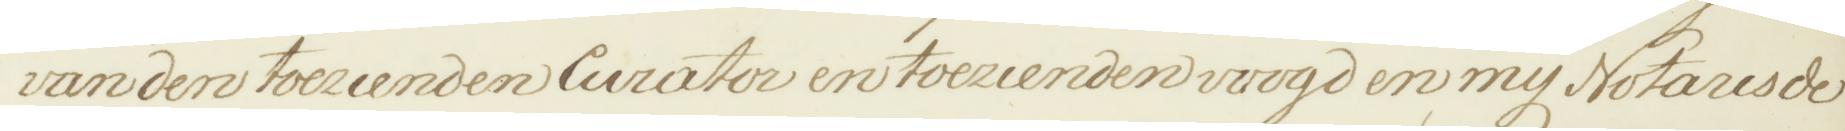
van den toezienden Curator en toezienden voogd en my Notaris de
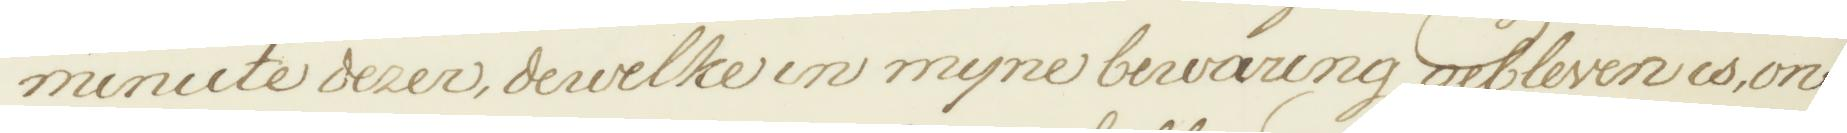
minute dezer, dewelke in myne bewaring gebleven is, on.
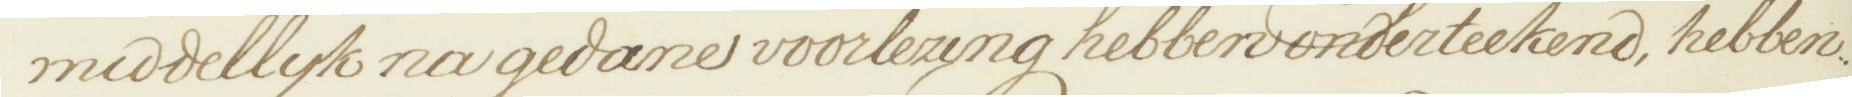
middellyk na gedane voorlezing hebben onderteekend, hebben
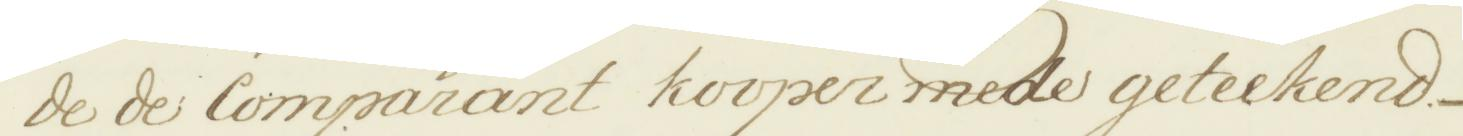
de de Comparant kooper mede geteekend.
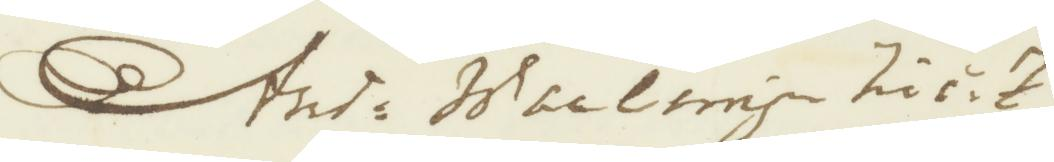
Ant= Waalewijn huiz
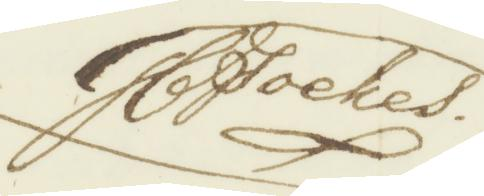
GC Joekes.
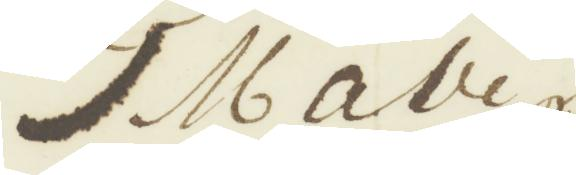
P Mabé j
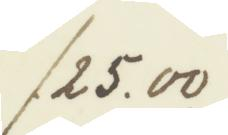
ƒ25.00
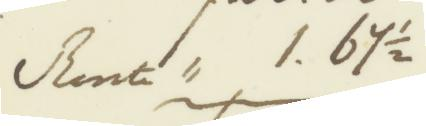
Rente „ 1.67½
